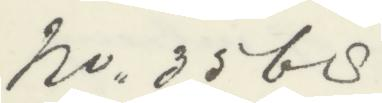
N„o 3568
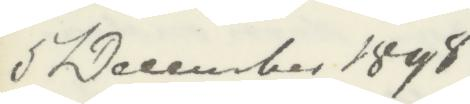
5 December 1898
